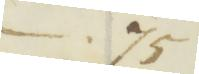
- .75
